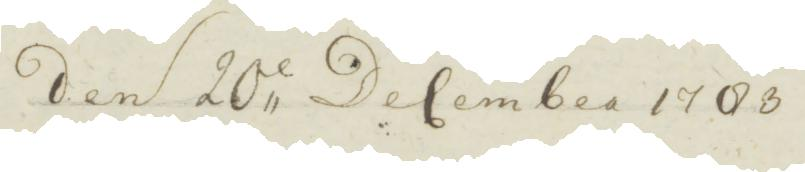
den 20„e December 1783
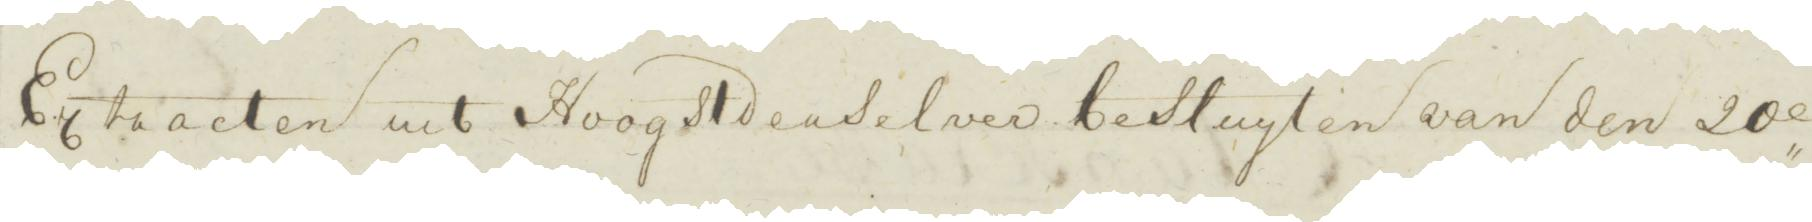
Extracten uit Hoogstdenselver besluijten van den 20„e
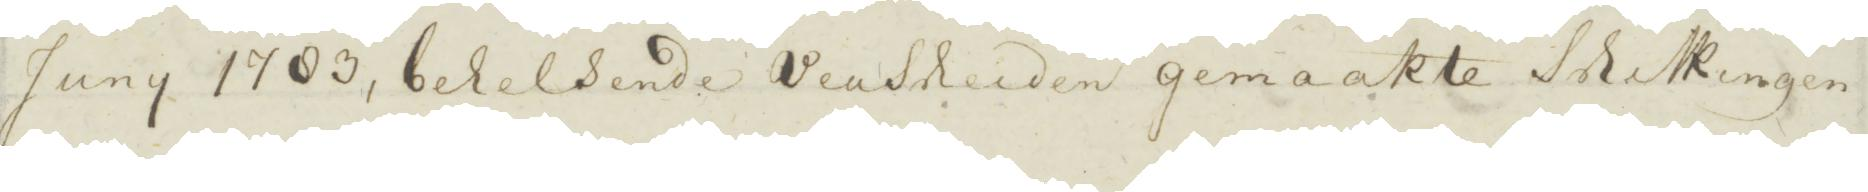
Junij 1783, behelsende verscheiden gemaakte schikkingen
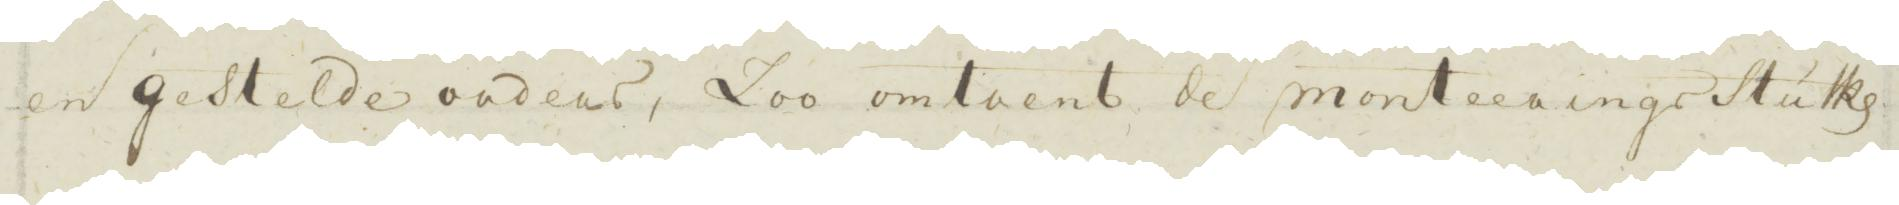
en gestelde orders, zoo omtrent de monteerings stukken
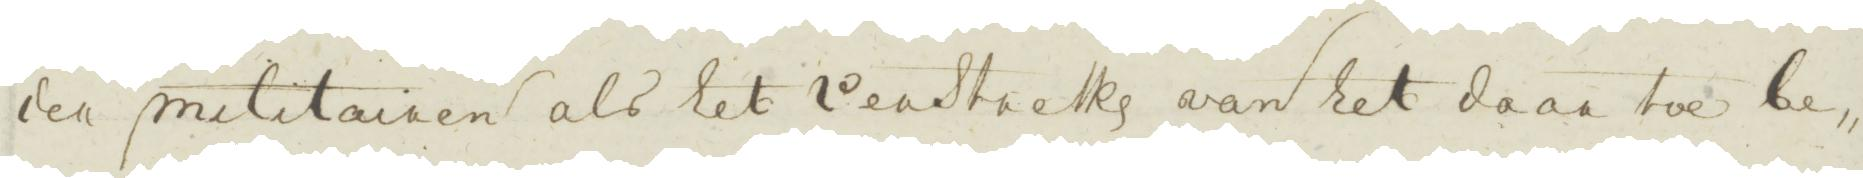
der militairen als het verstrekken van het daar toe be„
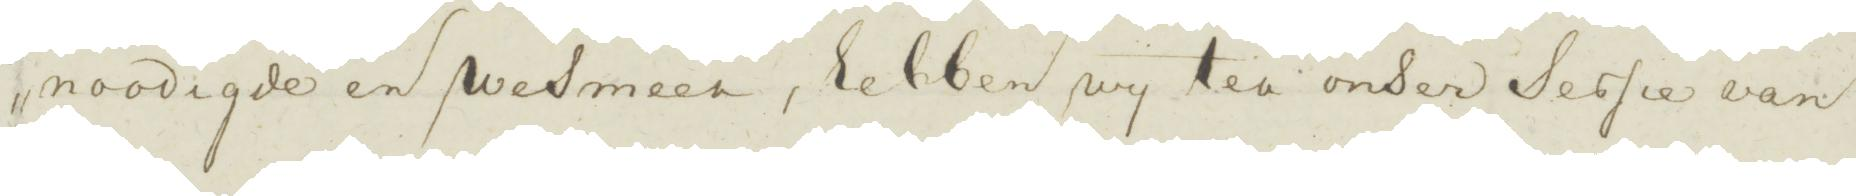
„noodigde en wesmeer, hebben wy ten onser sessie van
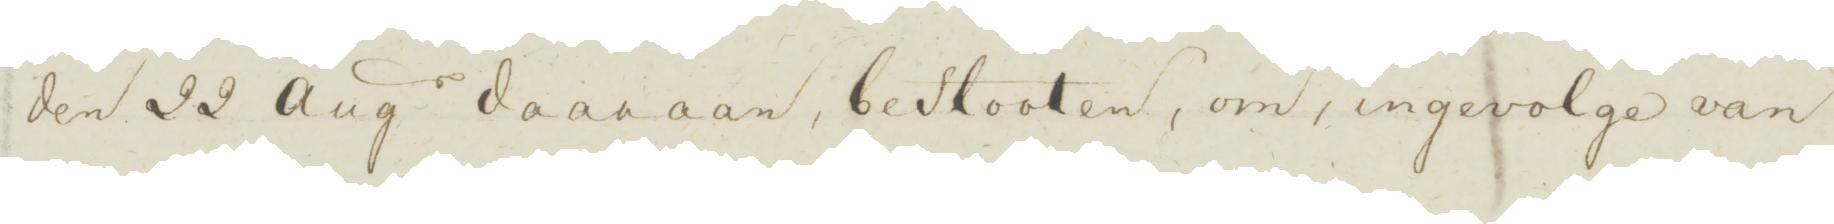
den 22 Aug:s daar aan, beslooten, om, ingevolge van
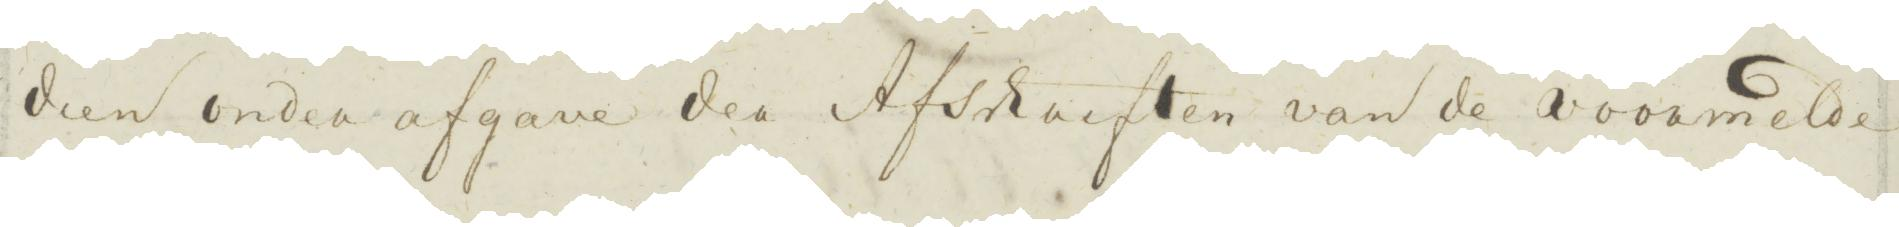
dien onder afgave der Afschriften van de voormelde
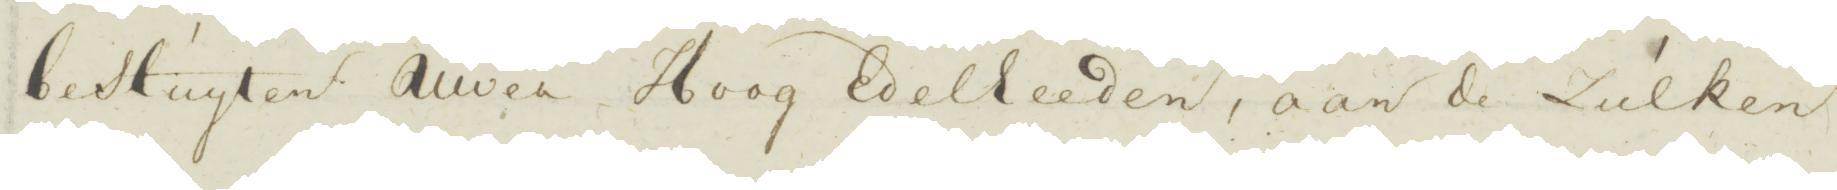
besluyten uwer Hoog Edelheeden, aan de zulken
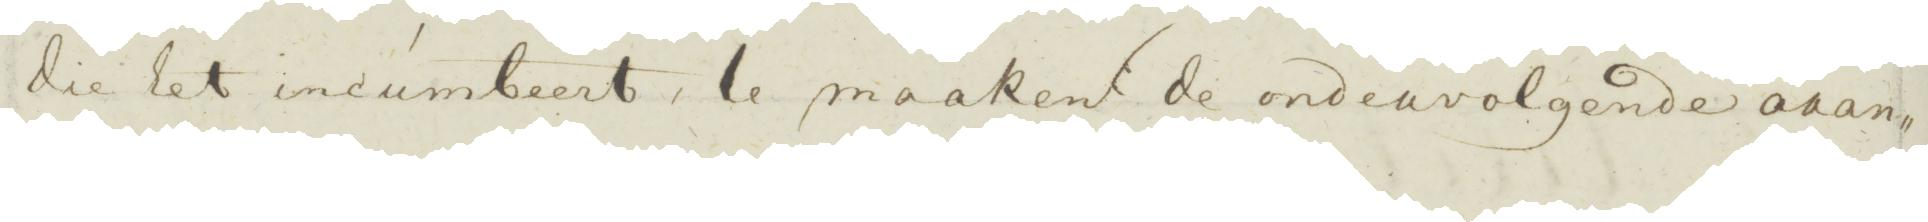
die het incumbeert, te maaken de ondervolgende aran„
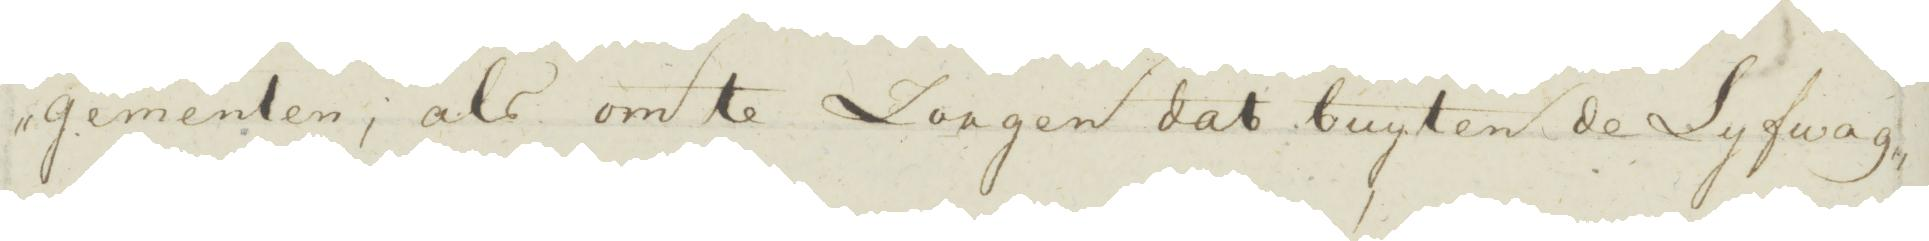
„gementen; als om te zorgen dat buijten de Lyfwag„
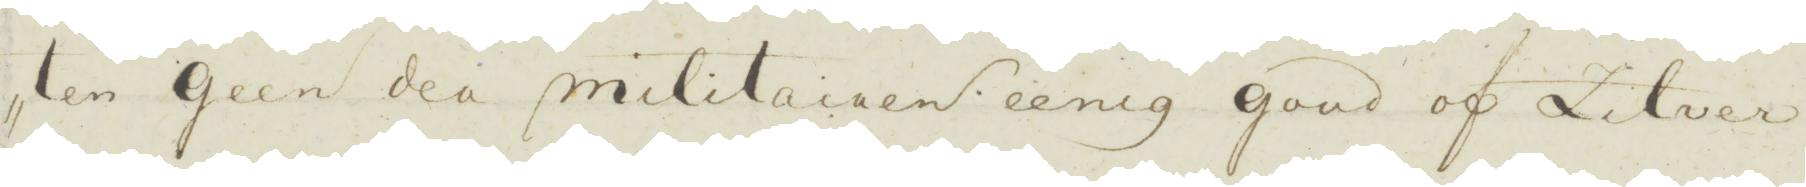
„ten geen der militairen eenig goud of zilver
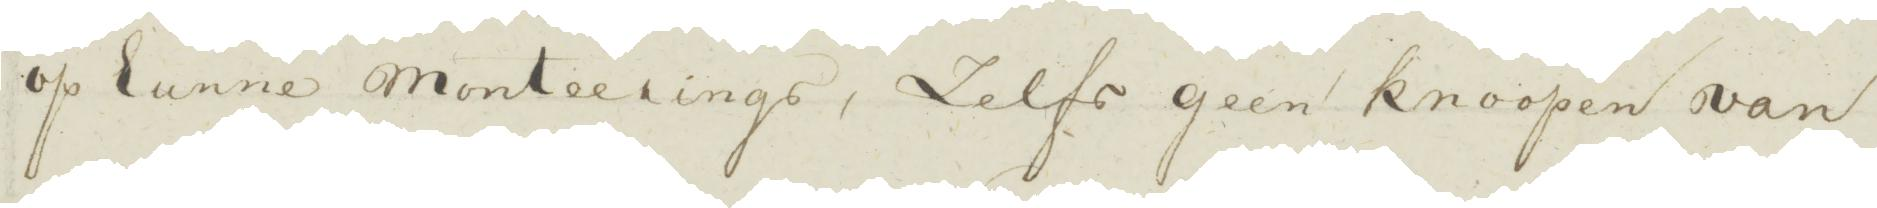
op hunne monteerings, zelfs geen knoopen van
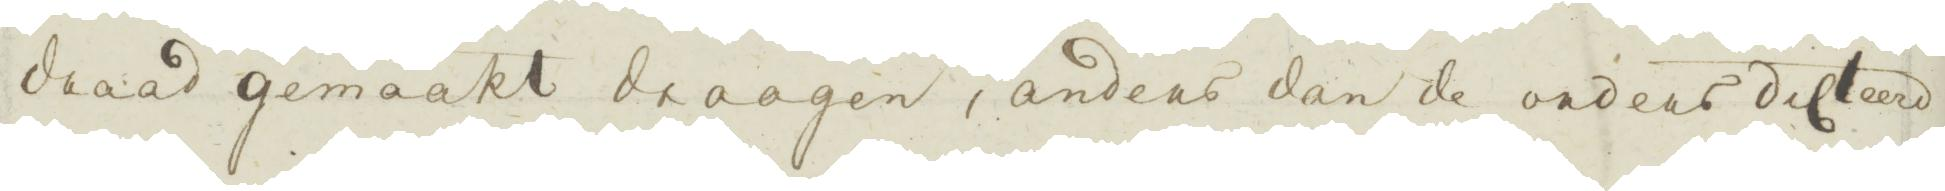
draad gemaakt draagen, anders dan de orders dicteerd
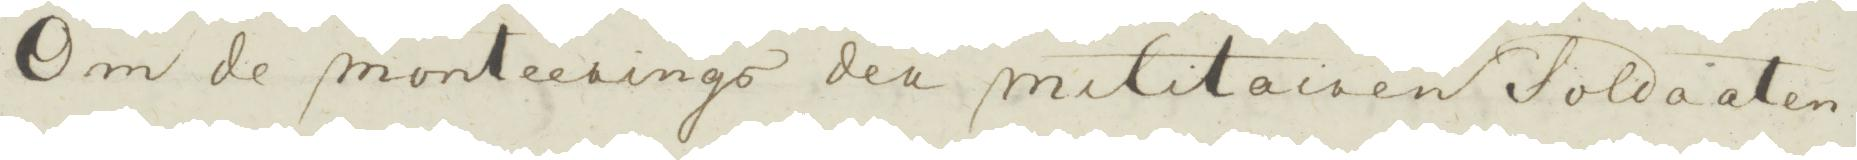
Om de monteerings der militairen soldaaten
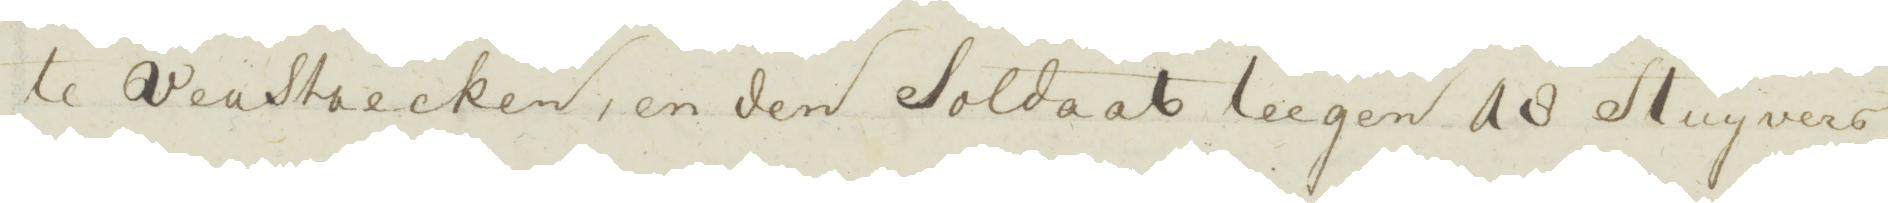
te verstrecken, en den soldaat teegen 48 stuijvers
